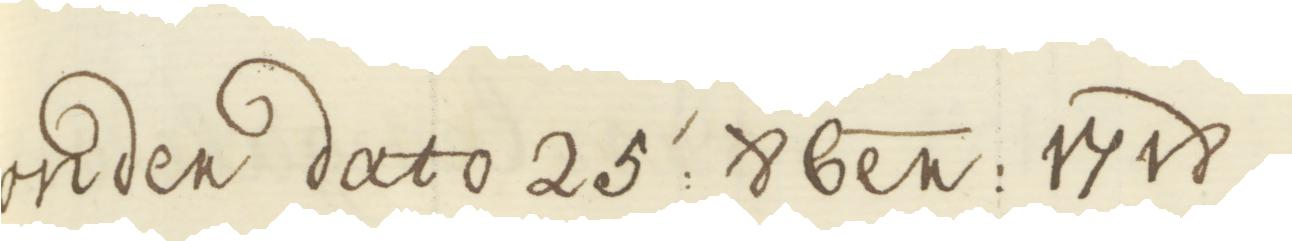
onder dato 25:' 8ber: 1718.
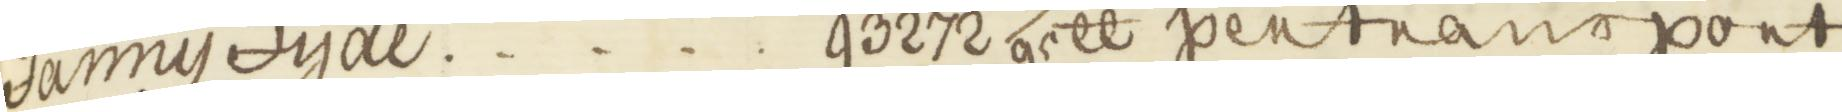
Tannij Sijde - - - - - 43272 16/95 lb per transport
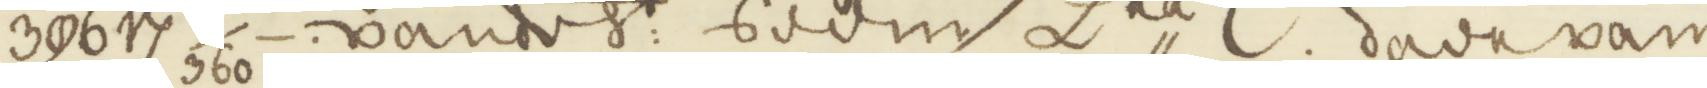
38617 1/360 — - vande s:t seem L„ra C. daer van
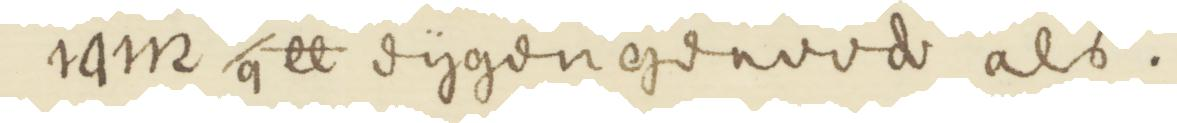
14112¾ lb eijgen gereede als.
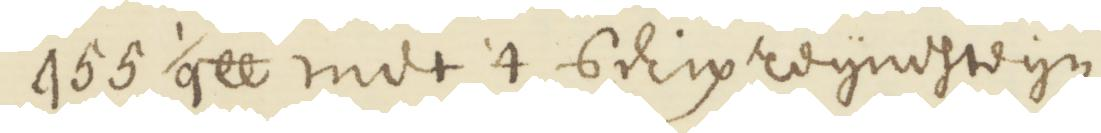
455¼ lb met ’t schip Reijnesteijn
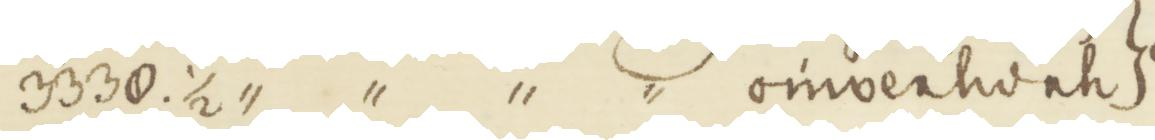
3338.½ „ „ „ „ ouwerkerk
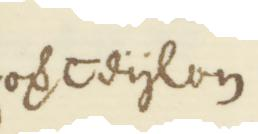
over Ceijlon
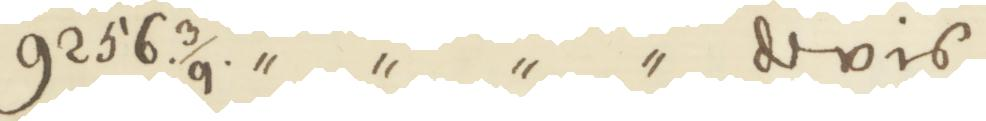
9256.¾. „ „ „ „ de vis
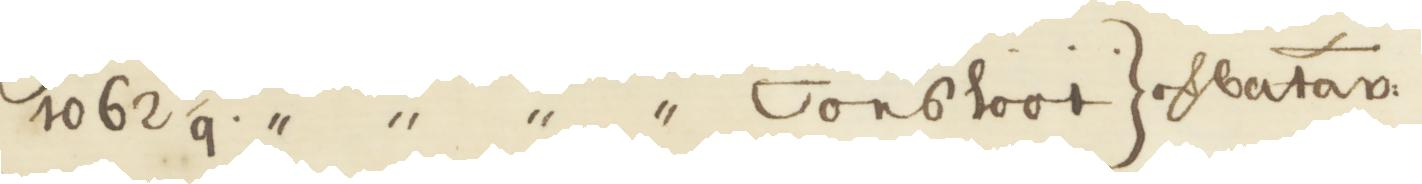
1062¼. „ „ „ „ Corsloot } over batav:
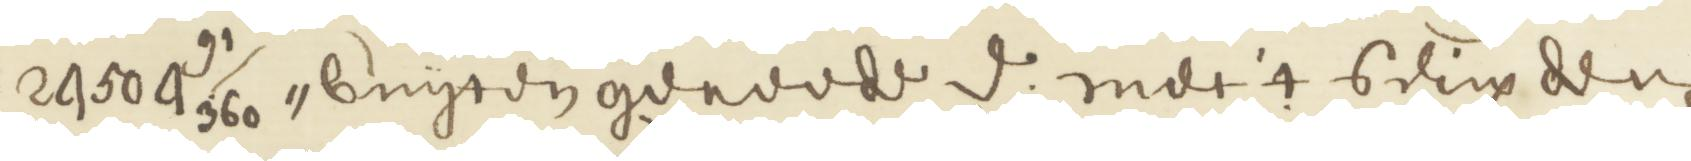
24504 91/360 „ buijten gereede D:o met ’t schip den
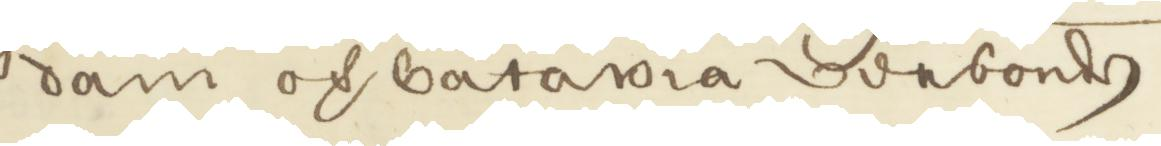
dam over batavia versonden
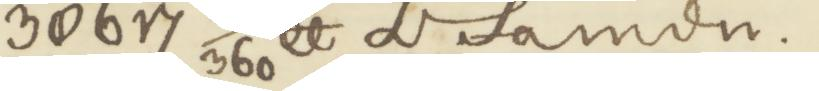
38617 1/360 lb tesamen. —
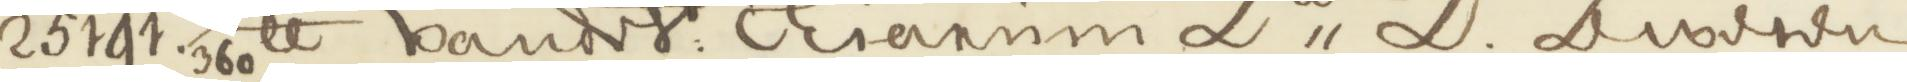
25141. 217/360 lb vande s:t Chiarum L„a D. teweten
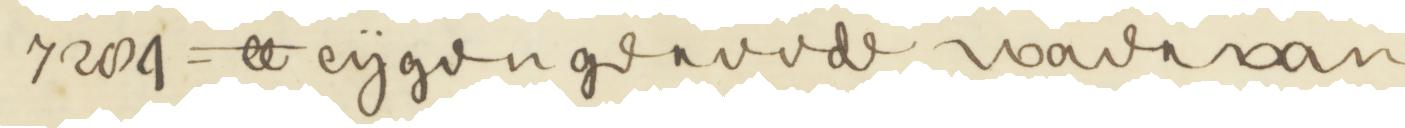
7284 - lb eijgen gereede waer van
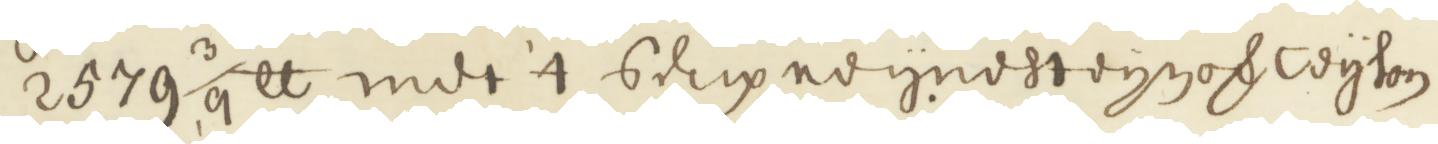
2579 3/9 lb met ’t schip reijnesteijn over Ceijlon
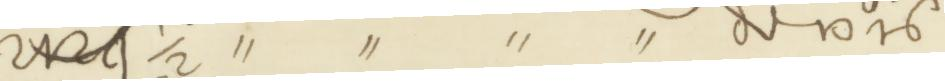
2129 1/2 „ „ „ „ de vis
